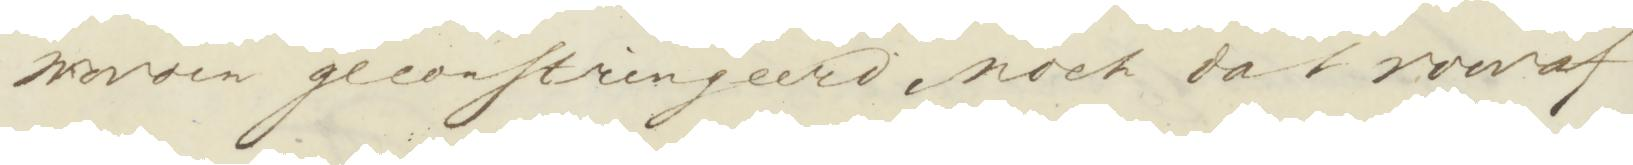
worden geconstringeerd, noch dat vooraf
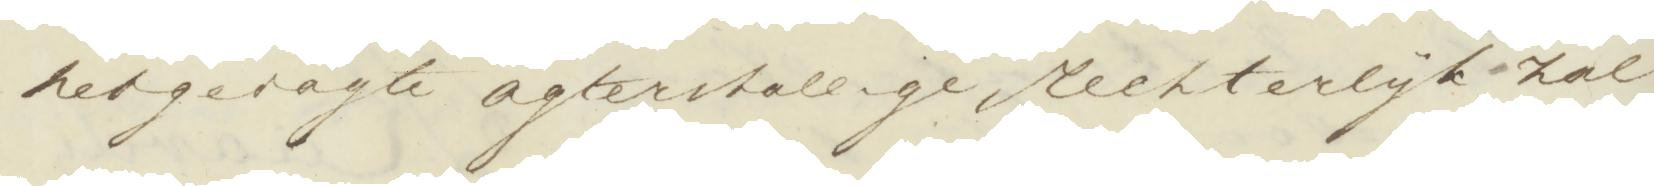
het gedagte agterstallige rechterlijk zal
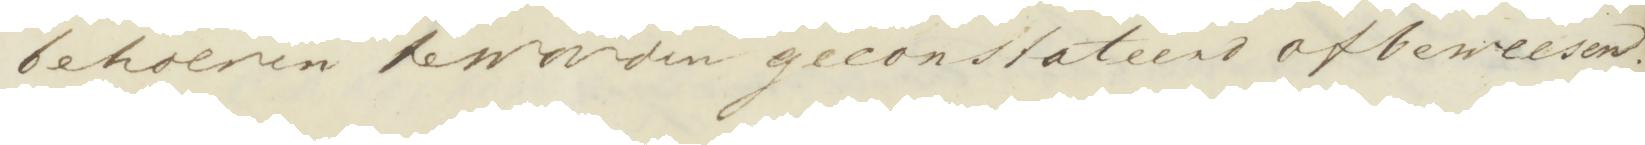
behoeven te worden geconstateerd of beweesen.
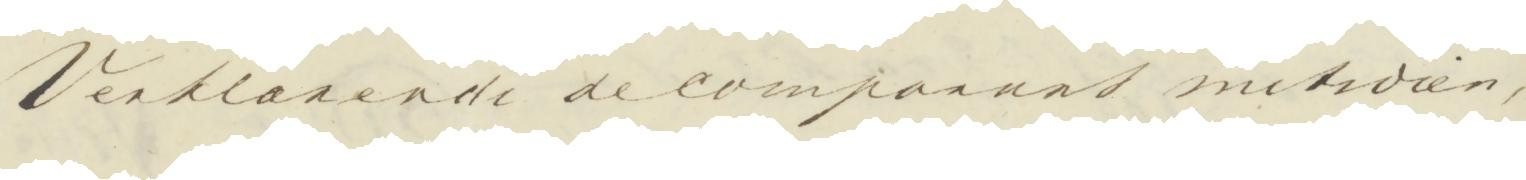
Verklarende de comparant mitsdien,
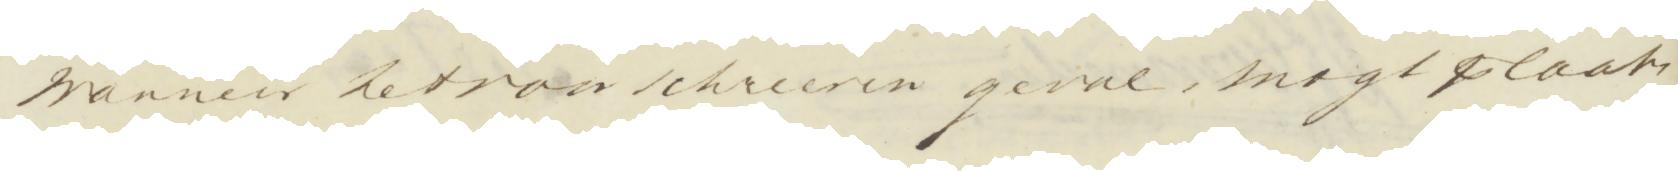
wanneer het voorschreeven geval, mogt plaats
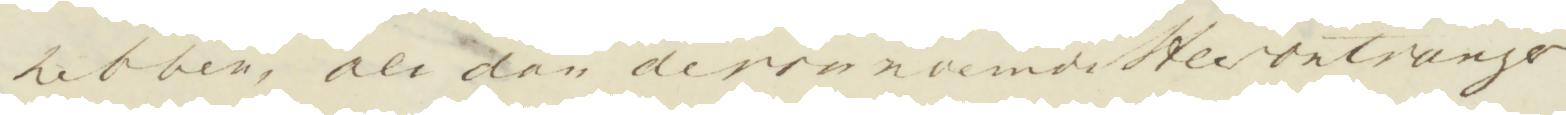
hebben, als dan de voor noemde Heer ontvanger
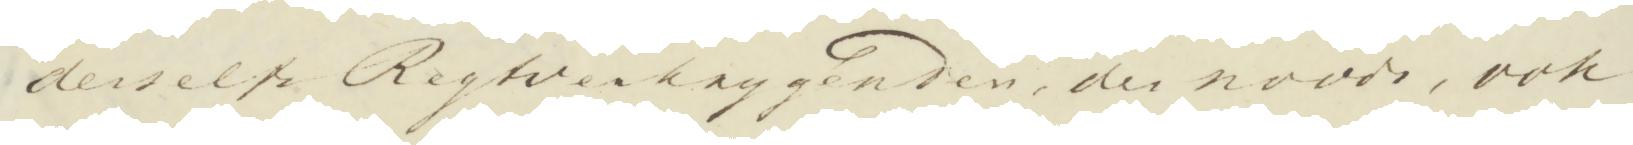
desselfs Regtverkrygenden, des noods, ook
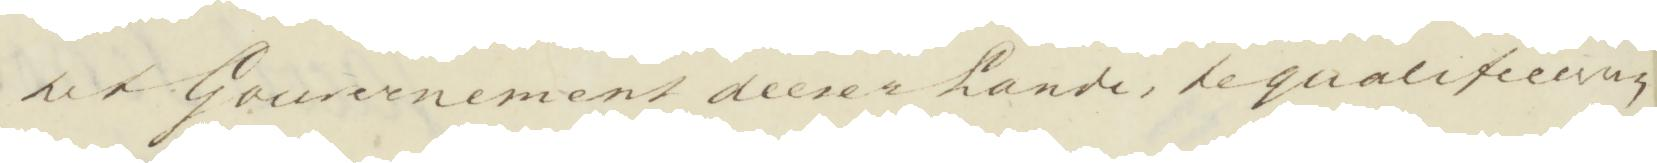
het Gouvernement deeser Lande, te qualificeren,
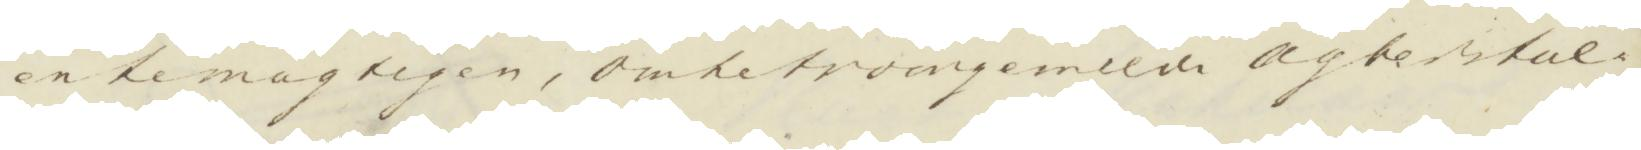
en te magtigen, om het voorgemelde agterstal„
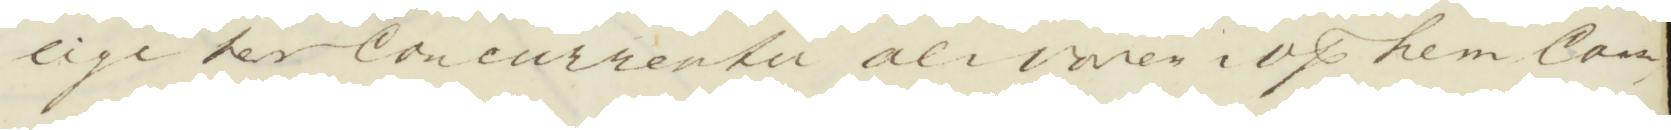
lige ter Concurrentie als voren,op hem Com
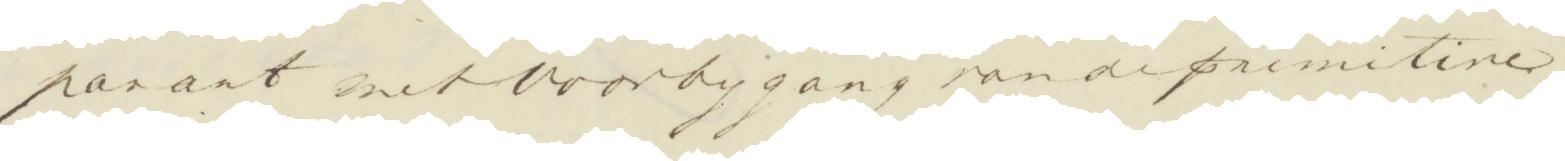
parant met voorbygang van de primitive
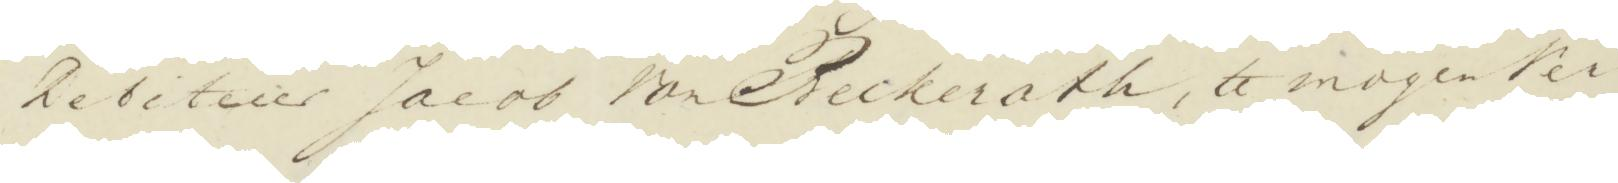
Debiteur Jacob van Beckerath, te mogen ver
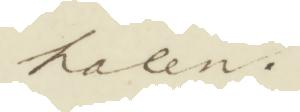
halen.
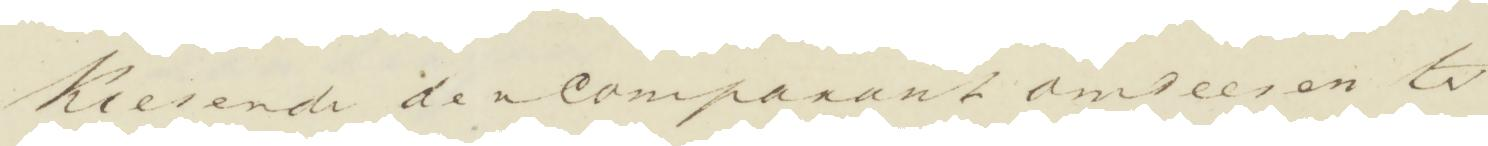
Kiesende den comparant omdeesen te
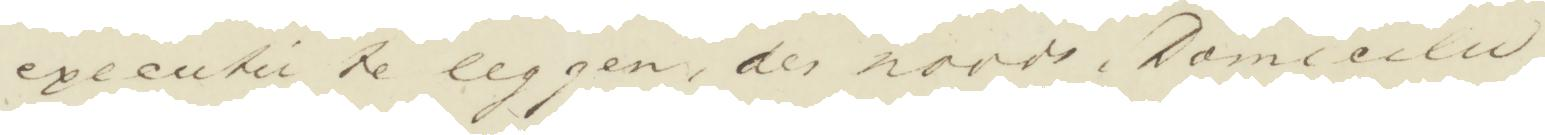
executie te leggen, des noods, Domicilie
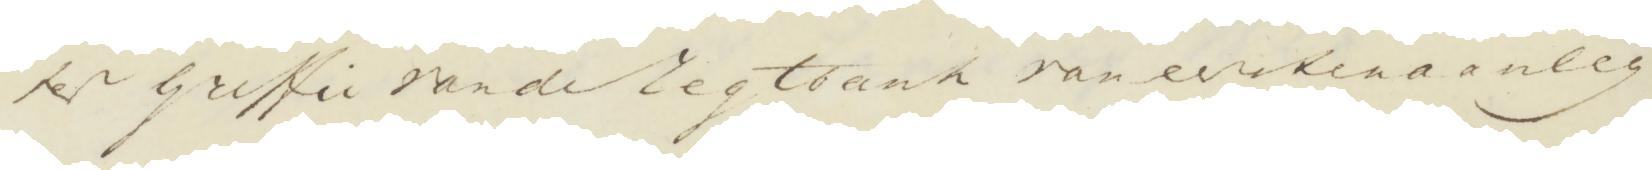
ter griffie van de regtbank van eersten aanleg
